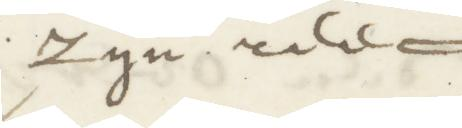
zijn reec
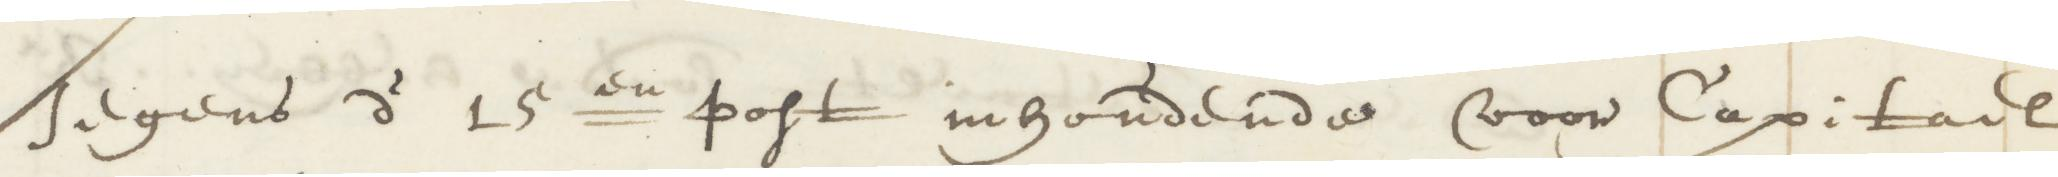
Tegens d’ 15=en post inhoudende voor Capitael
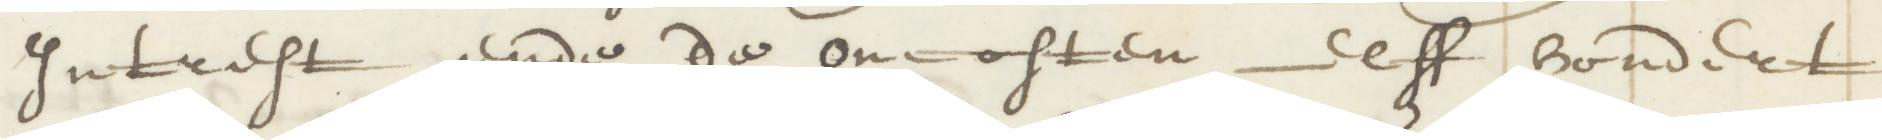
Jntrest ende de oncosten elff hondert
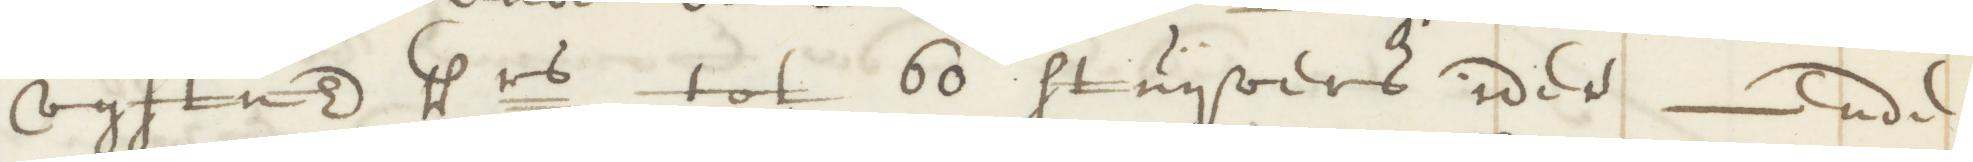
vijftig R=rs tot 60 stuijvers ider ende
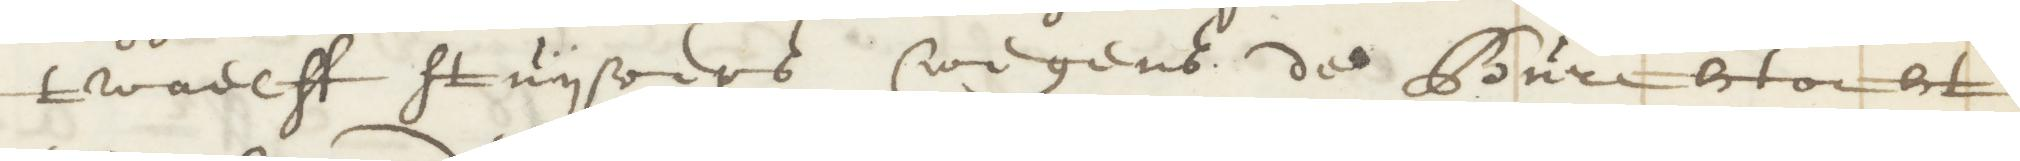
twaelff stuijvers wegens de Burchtocht
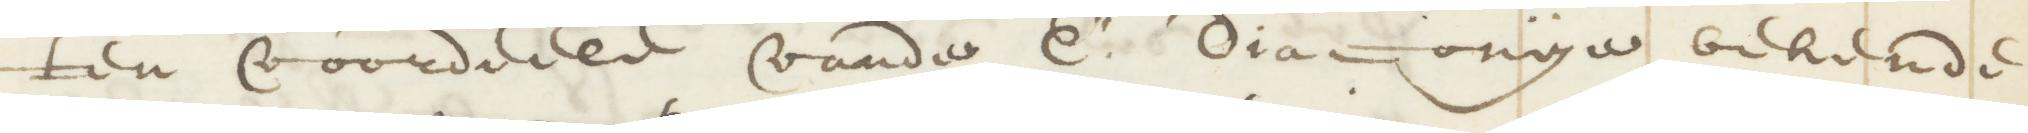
ten voordeele vande E: diaconije bekende
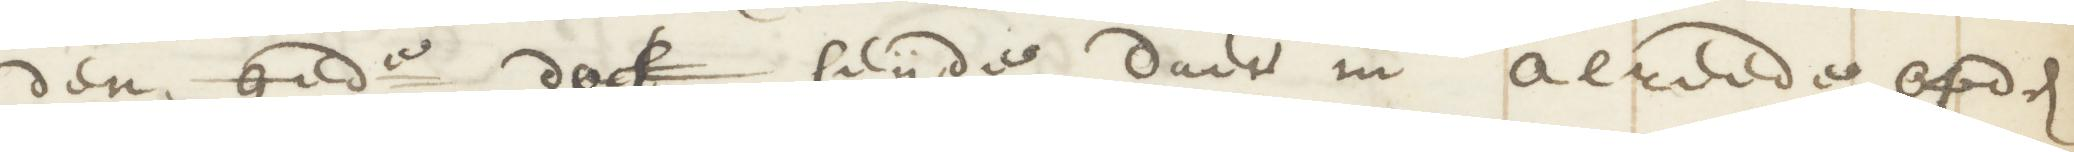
den ged=e dach seijde daer in alreede opden
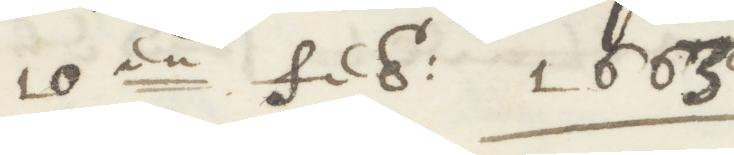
10=en feb: 1663
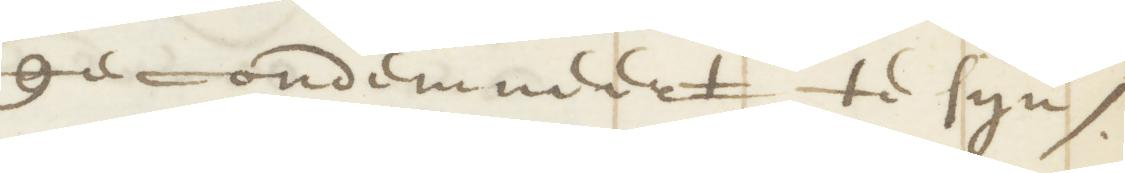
gecondemneert te sijn
